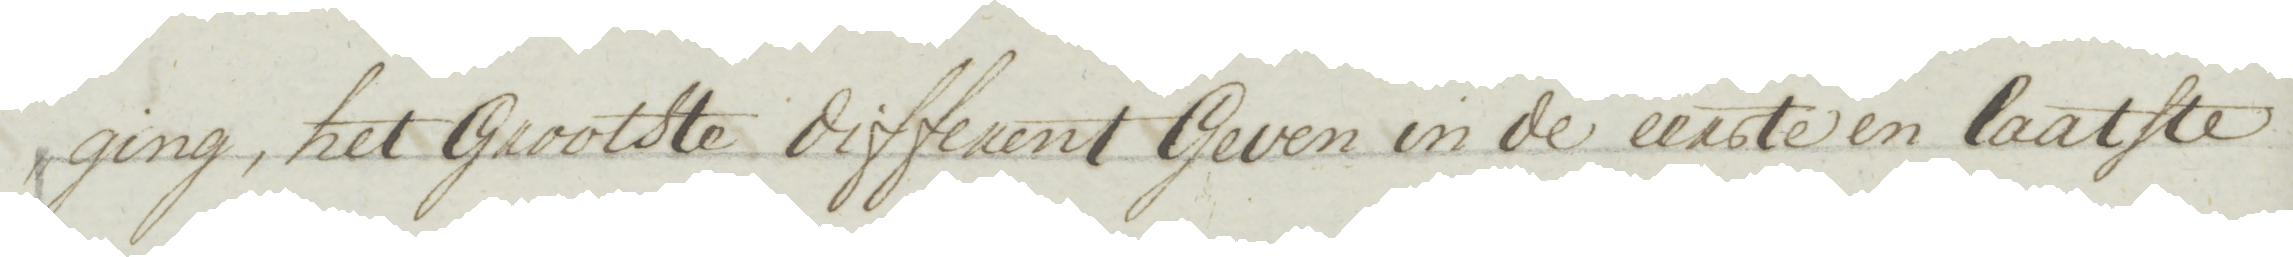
„ging, het Grootste different Geven in de eerste en laatste
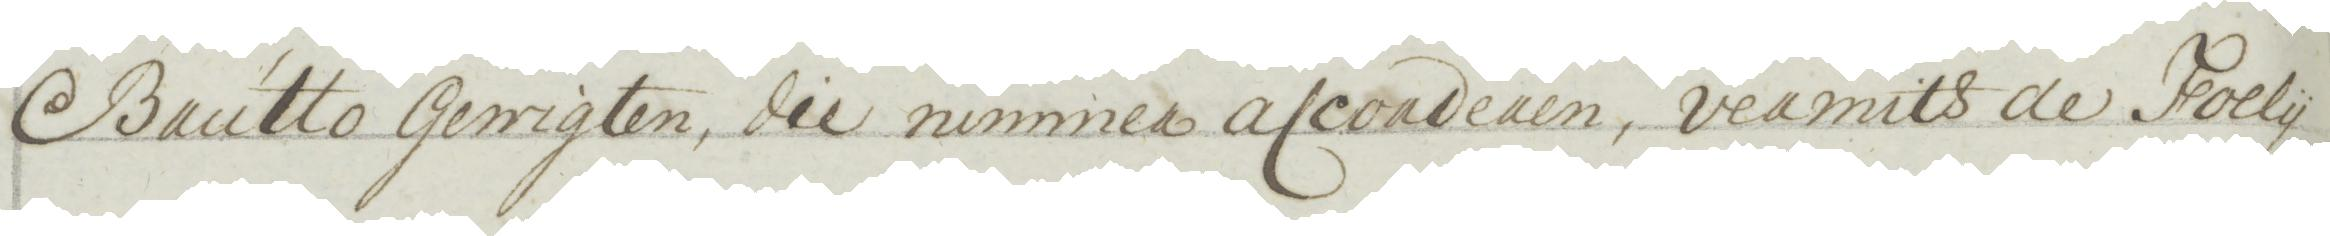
Brutto Gewigten, die nimmer accorderen, vermits de Foelij
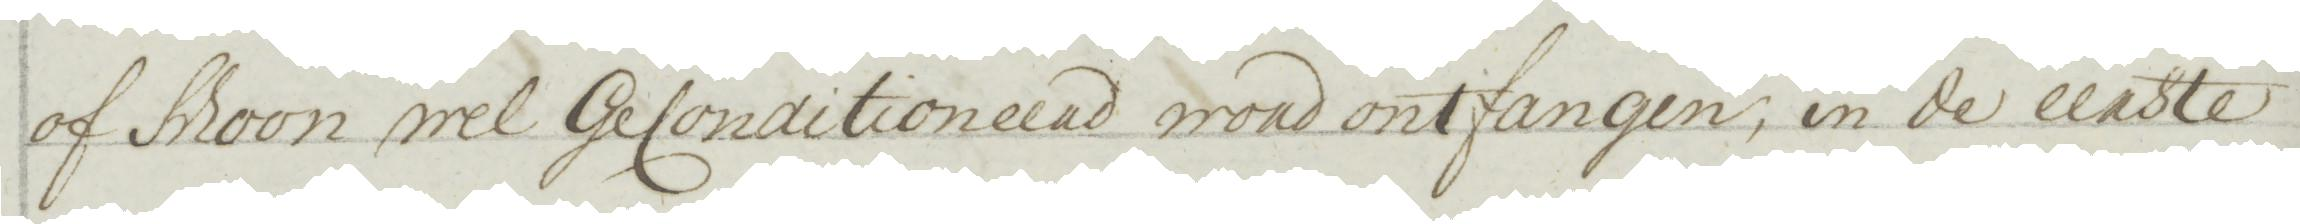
of schoon wel Geconditioneerd word ontfangen, in de eerste
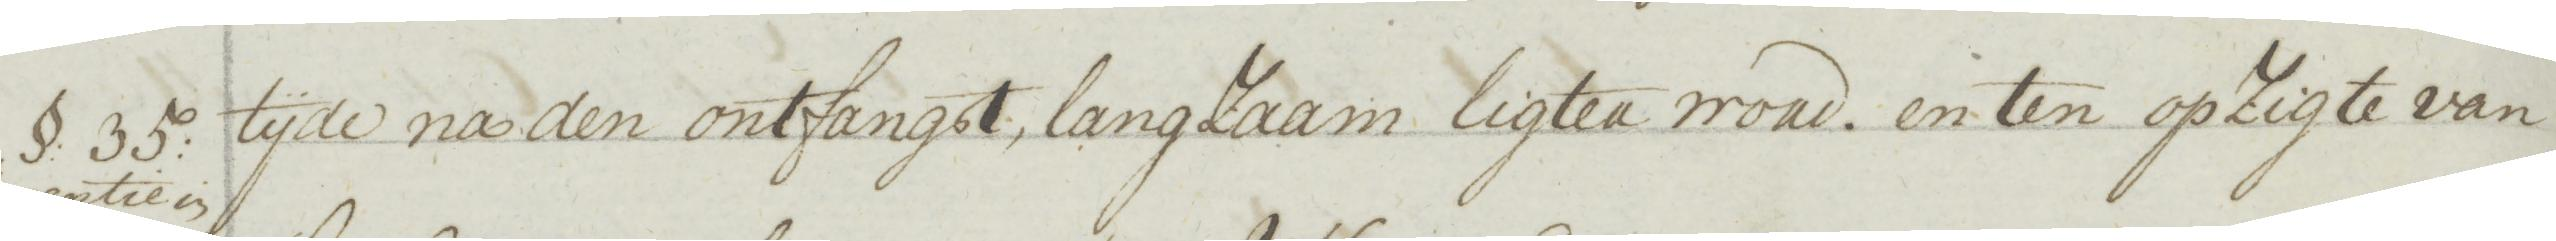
§: 35: tijde na den ontfangst, langzaam ligter word. en ten opzigte van
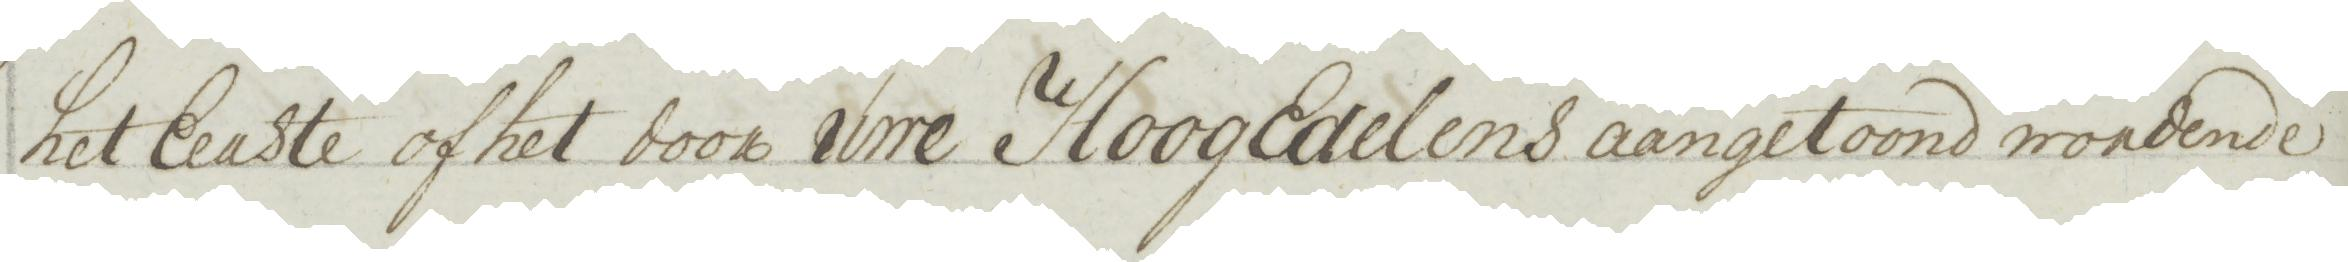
het Eerste of het door uwe Hoog Edelens aangetoond wordende
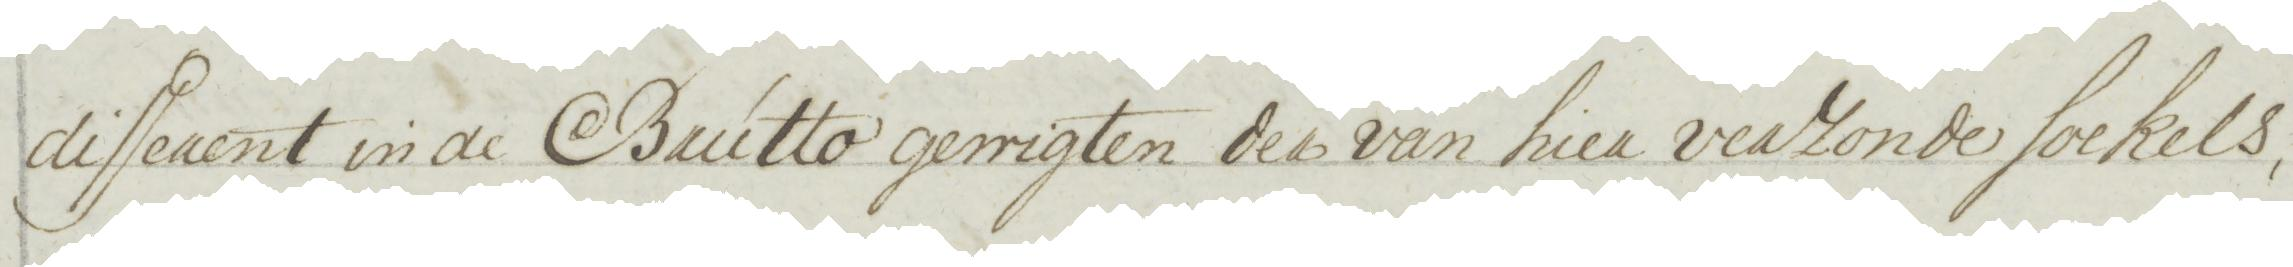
different in de Brutto gewigten der van hier verzonde soekels,
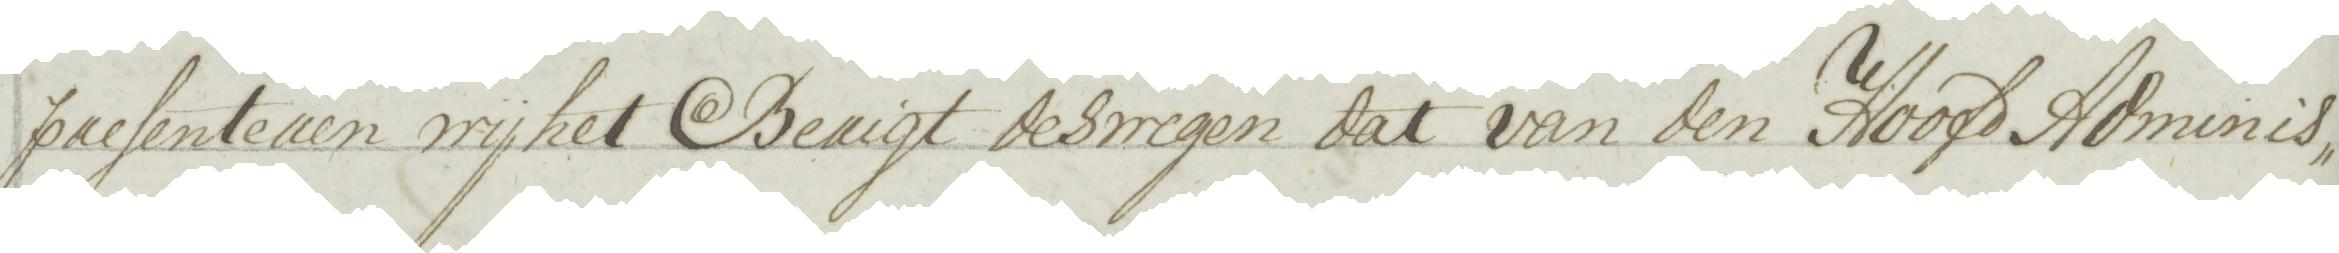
presenteren wij het Berigt deswegen dat van den Hoofd Adminis„
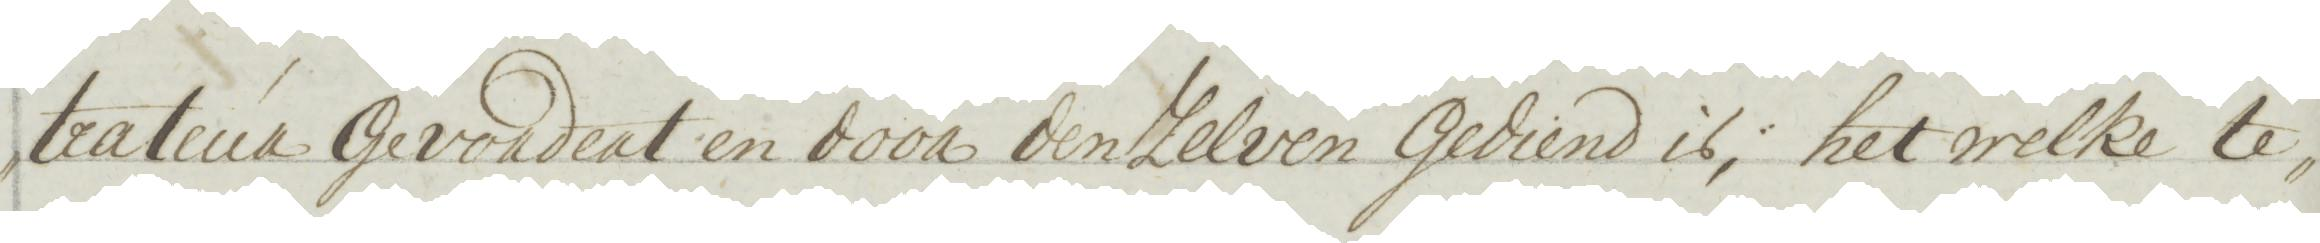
„trateur Gevordert en door den zelven Gediend is, het welke te„
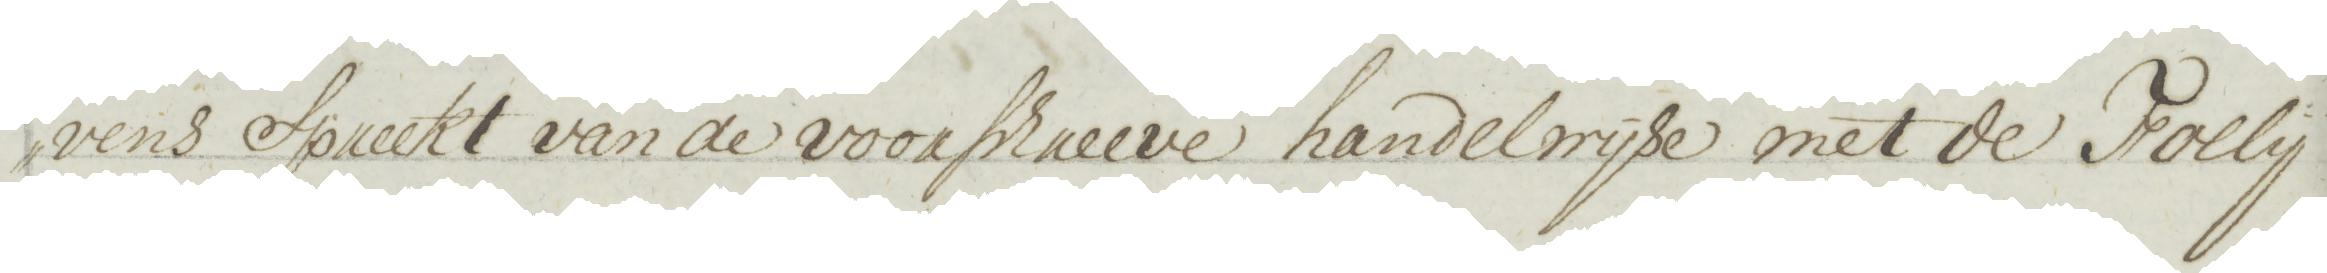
„vens spreekt van de voorschreeve handelwijse met de Foelij
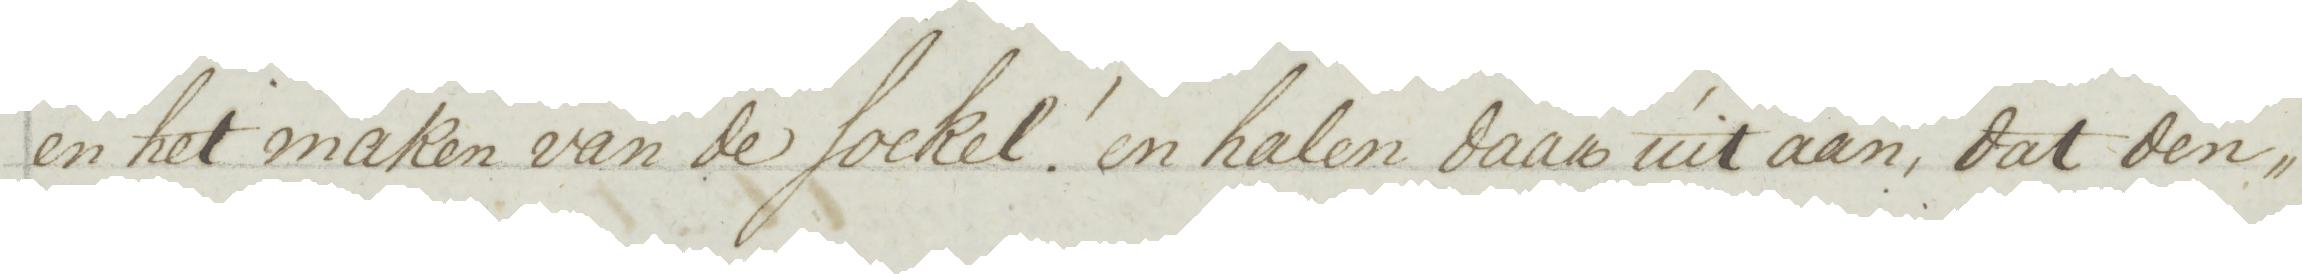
en het maken van de soekel! en halen daar uit aan, dat den„
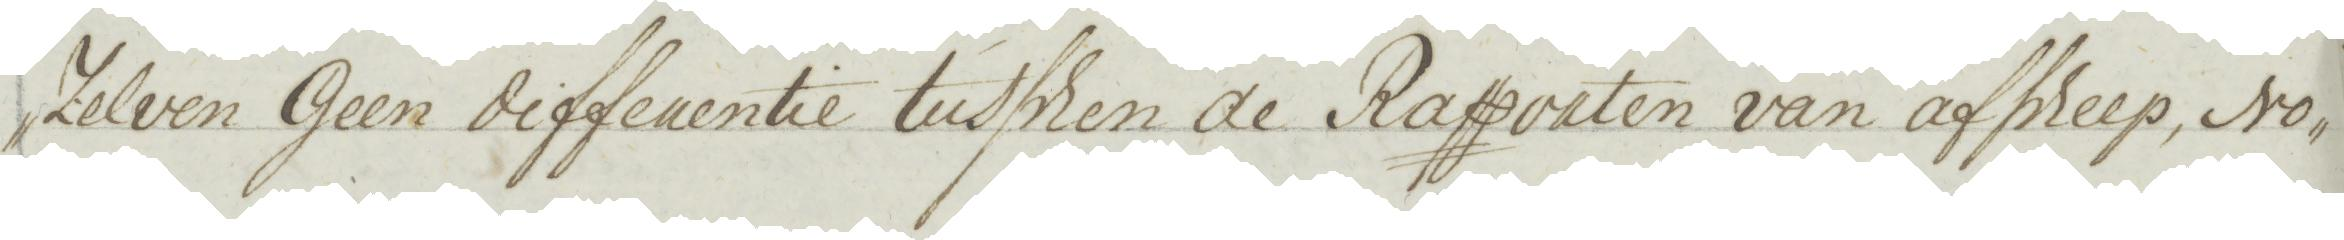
„zelven geen differentie tusschen de Rapporten van afscheep, No„
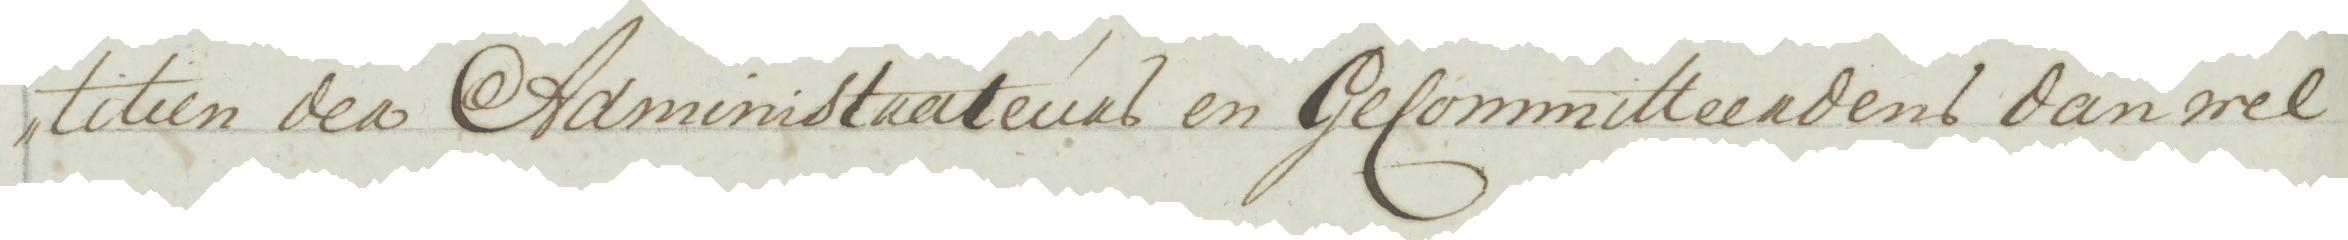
„titien der Administrateurs en Gecommitteerdens dan wel
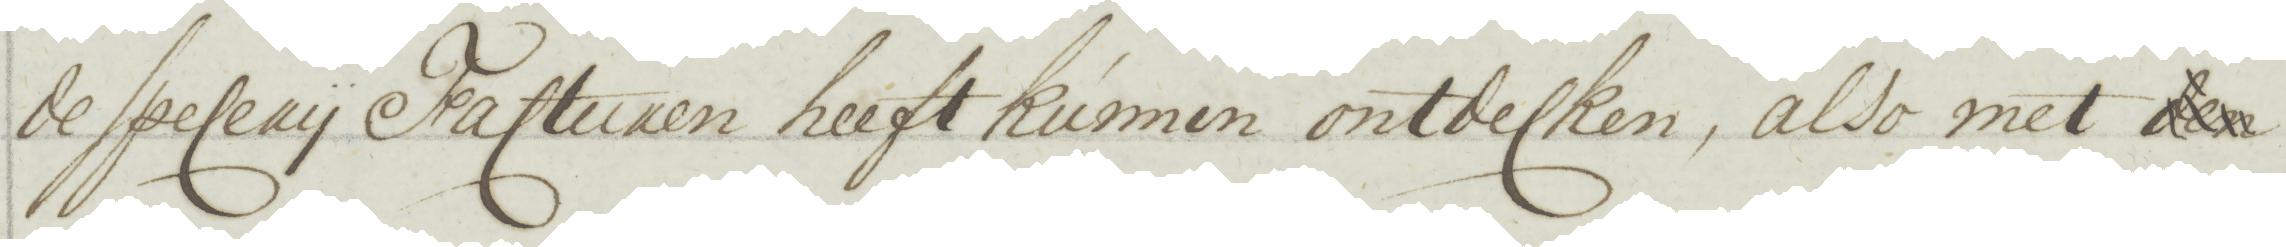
de specerij Facturen heeft kunnen ontdecken, also met den
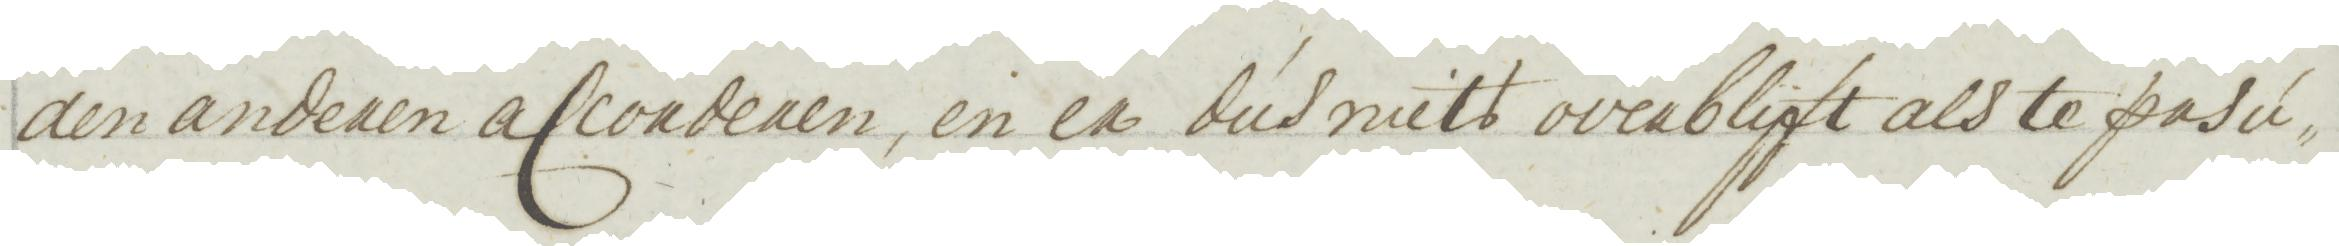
den anderen accorderen, en er dus niets overblijft als te pasu„
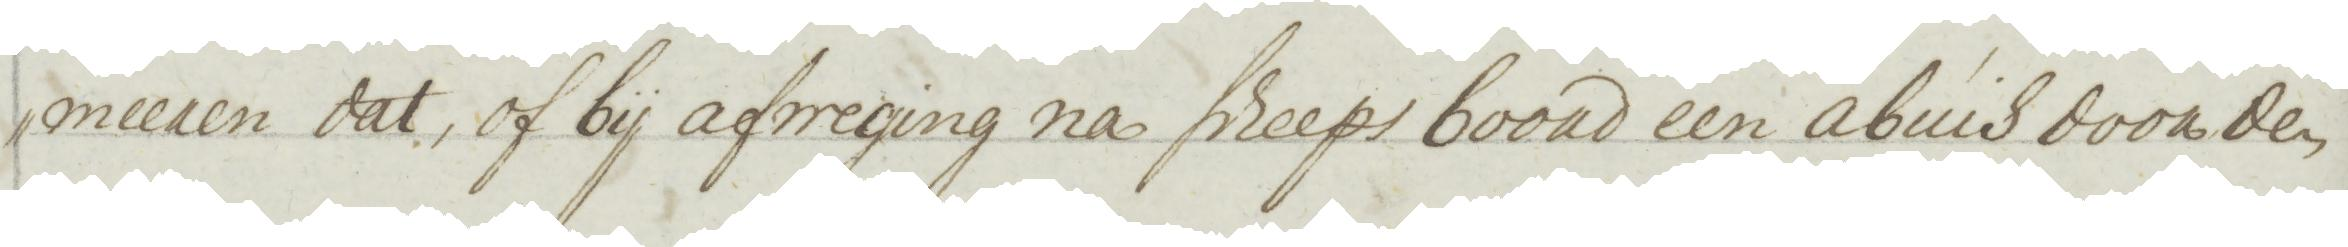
„meeren dat, of bij afweging na scheeps boord een abuis door den
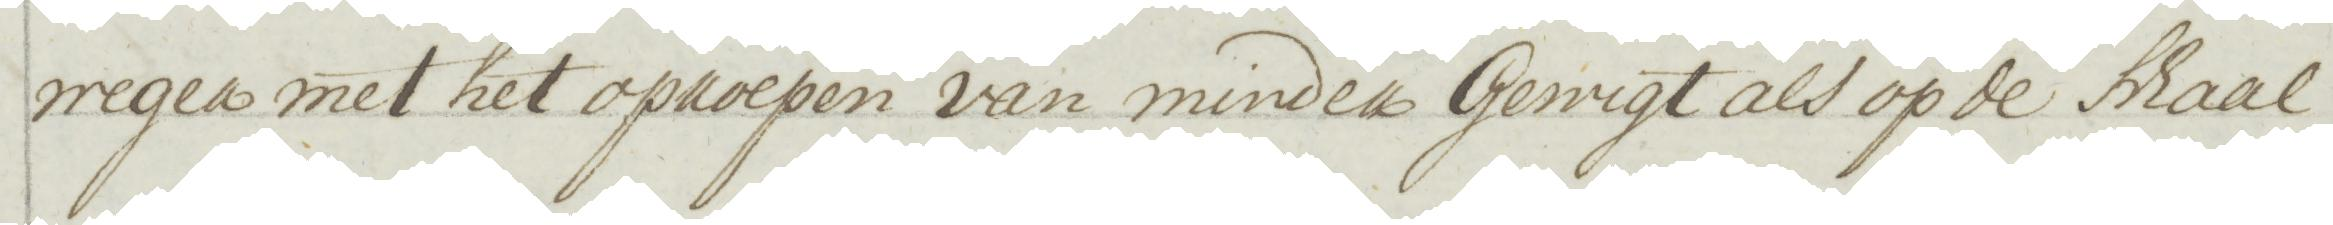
weger met het oproepen van minder Gewigt als op de schaal
